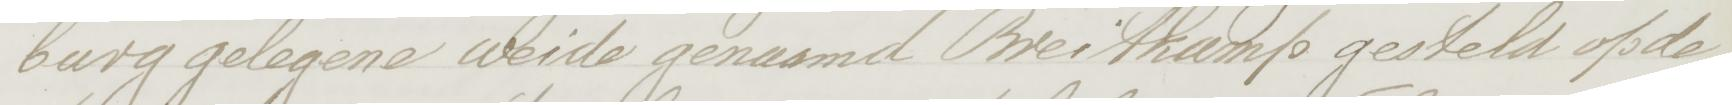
burg gelegene weide genaamd Breitkamp gesteld op de
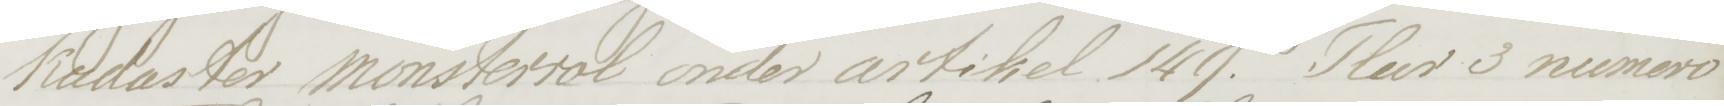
Kadaster monsterrol onder artikel 149. Flur 3 numero
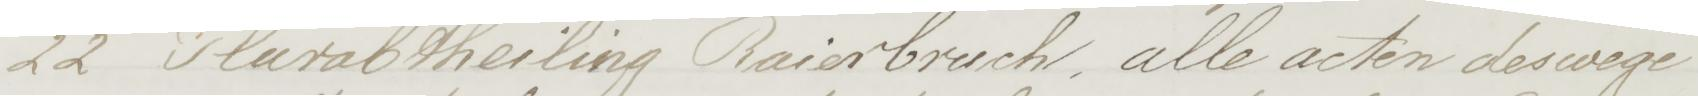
22 Flurabtheiling Raierbruch, alle acten deswege
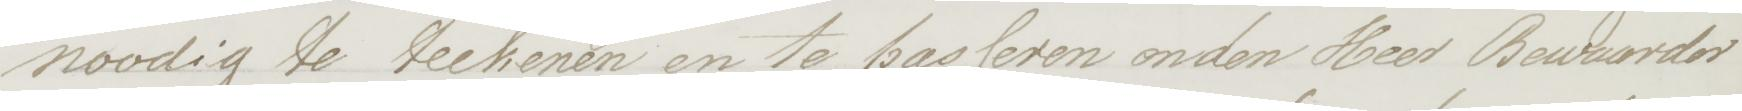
noodig te teekenen en te passeren en den Heer Bewaarder
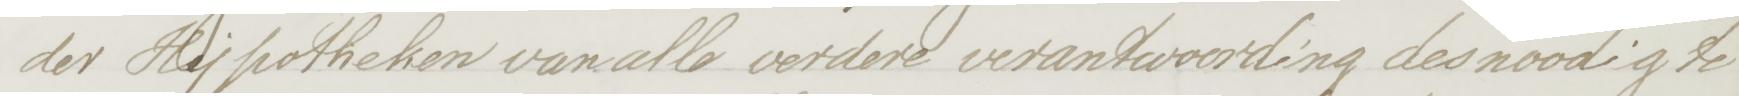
der Hijpotheken van alle verdere verantwoording des noodig te
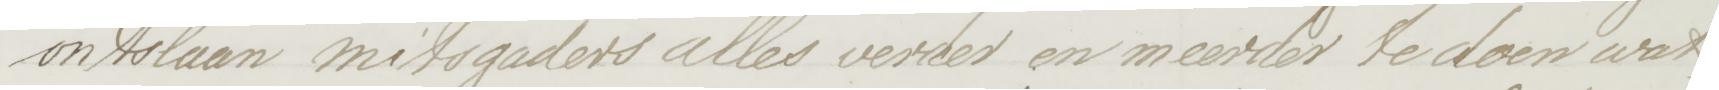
ontslaan mitsgaders alles verder en meerder te doen wat
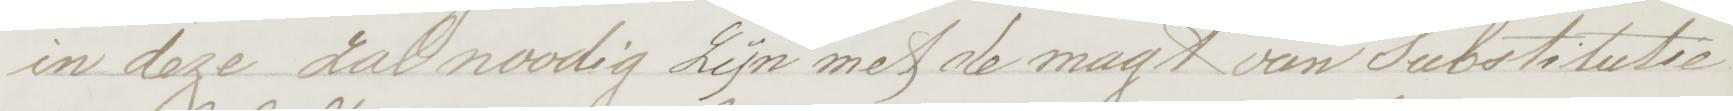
in deze zal noodig zijn met de magt van substitutie
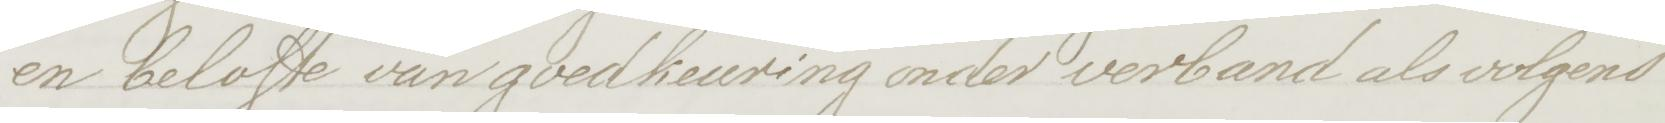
en belofte van goedkeuring onder verband als volgens
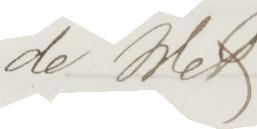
de Wet
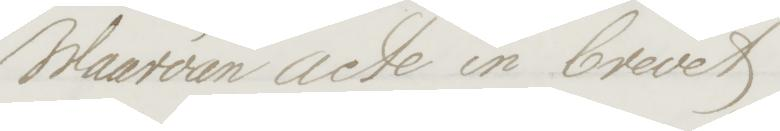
Waarvan acte en brevet
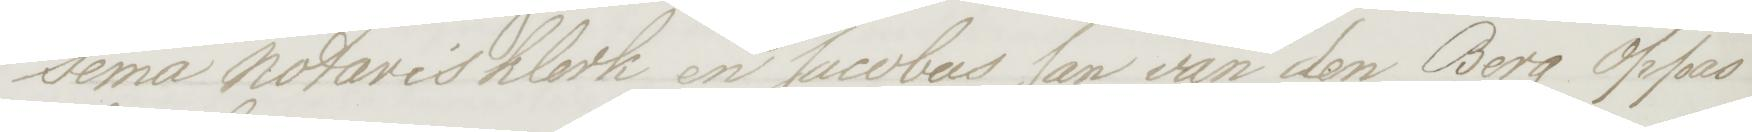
sema notarisklerk en Jacobus Jan van den Berg Oppas
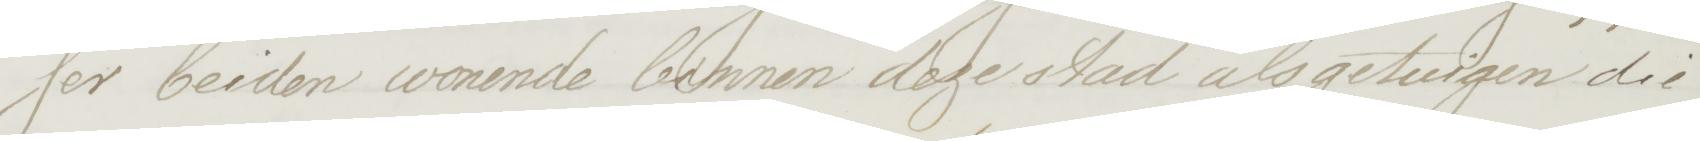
ser beiden wonende binnen deze stad als getuigen die
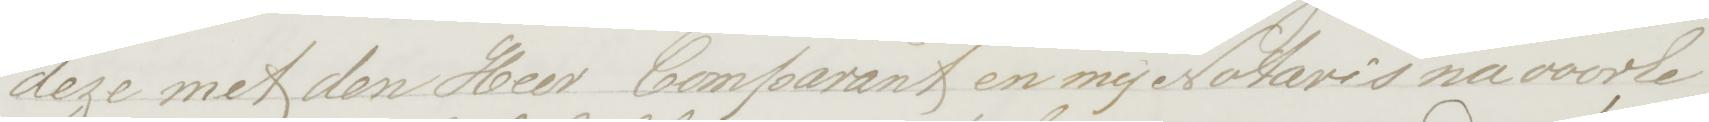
deze met den Heer Comparant en mij Notaris na voorle
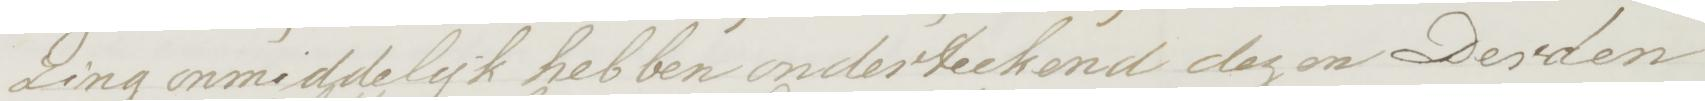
zing onmiddelijk hebben onderteekend dezen Derden
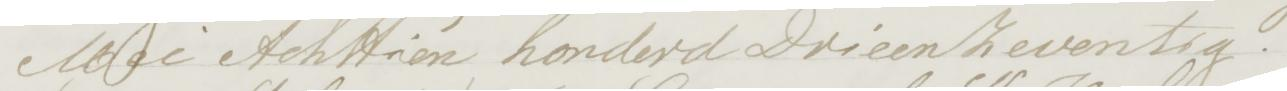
Mei Achttien honderd Drie en Zeventig.
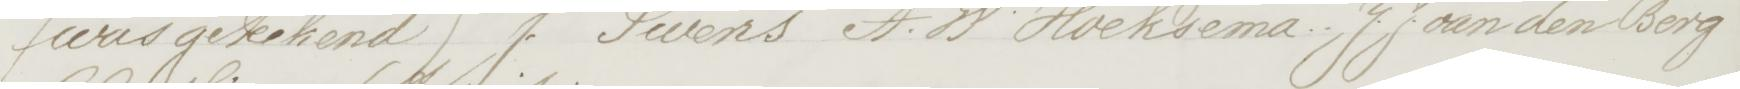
/was geteekend/ J. Swens A: W: Hoeksema. J. J. van den Berg
